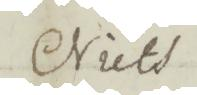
Niets
